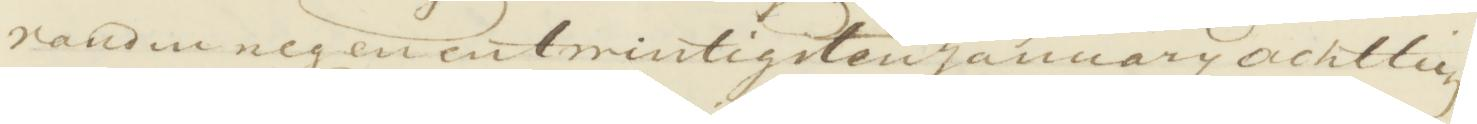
vanden negen entwintigsten January achttien
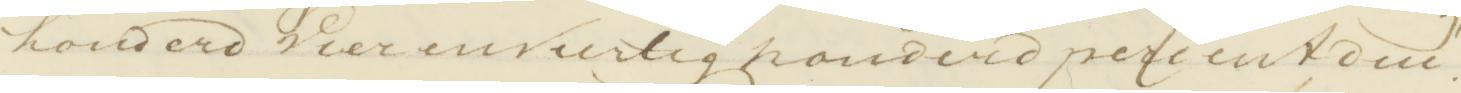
honderd Vier en veertig honderd percent dui
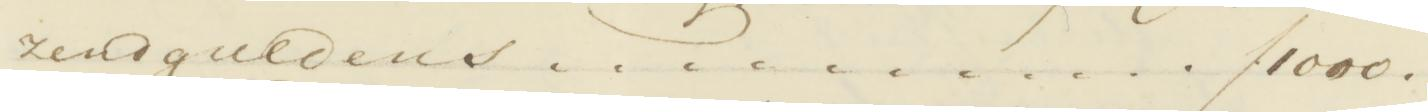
zend guldens . . . . . . . . . . . ƒ1000.
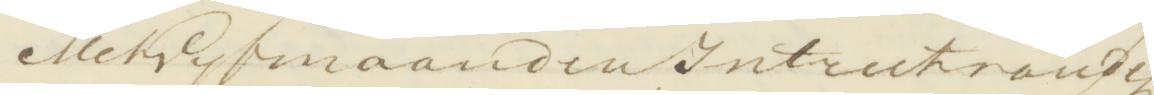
Met Vyf maanden Intrest vanden
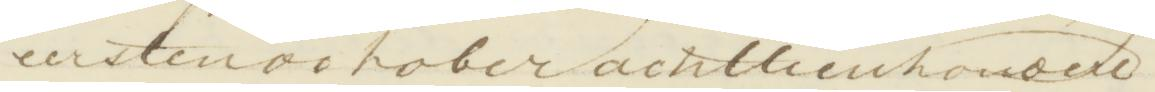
eersten october achttienhonderd
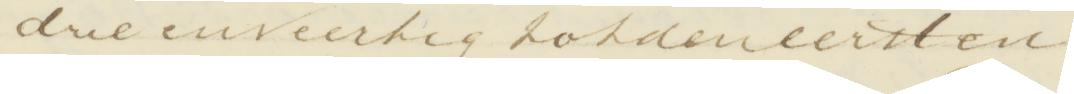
drie en veertig tot den eersten
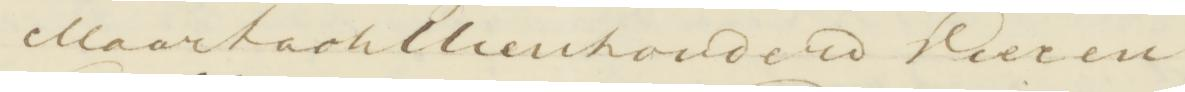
Maart achttienhonderd Vier en
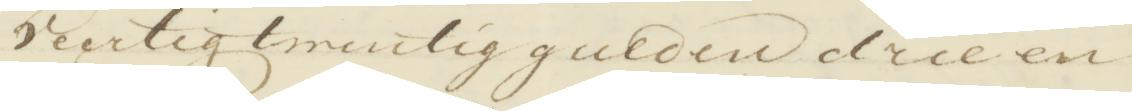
Veertig twintig gulden drie en
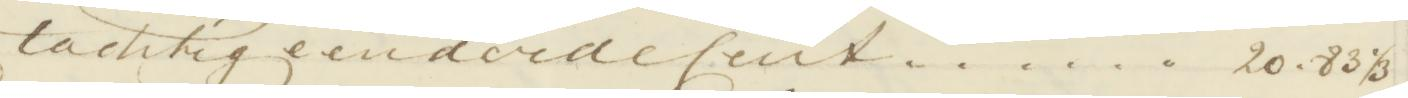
tachtig een derde Cent . . . . . „ 20. 83 1/3
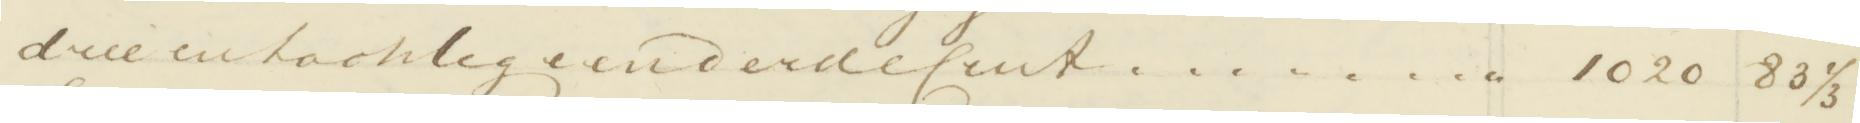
drie en tachtig een derde Cent . . . . . . . „ 1020 83 1/3
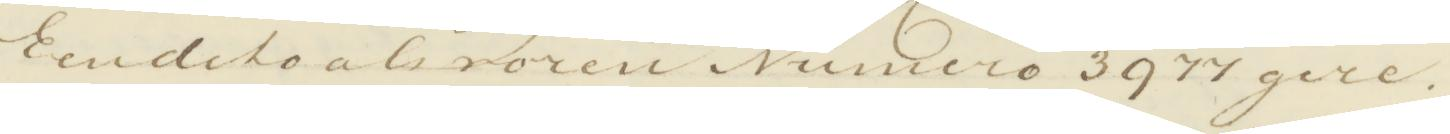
Een dito als voren Numero 3977 gere.
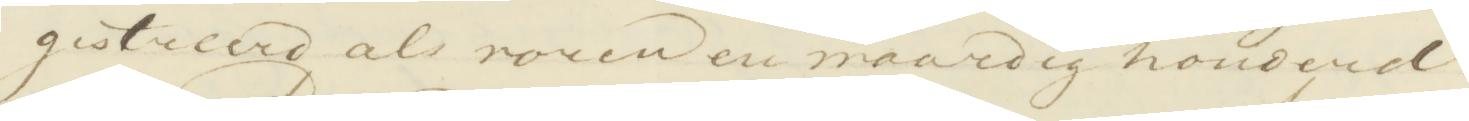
gistreerd als voren en waardig honderd
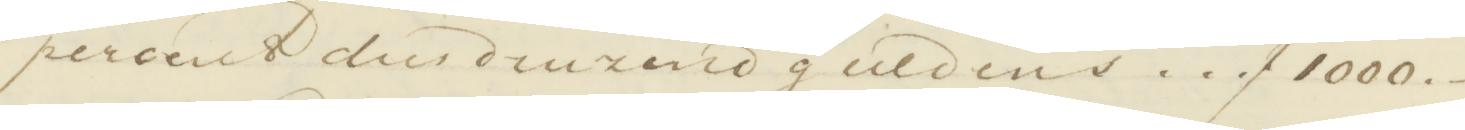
percent dus duizend guldens . . . ƒ 1000. —
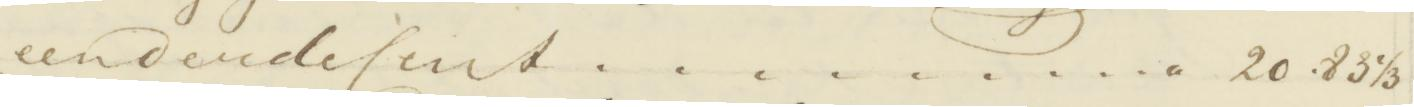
eenderde Cent . . . . . . . . . „ 20. 83 1/3
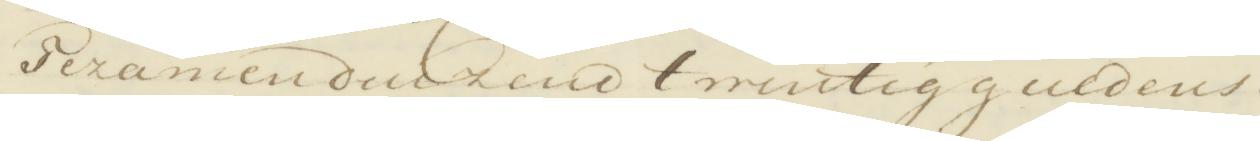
Tezamen duizend twintig guldens
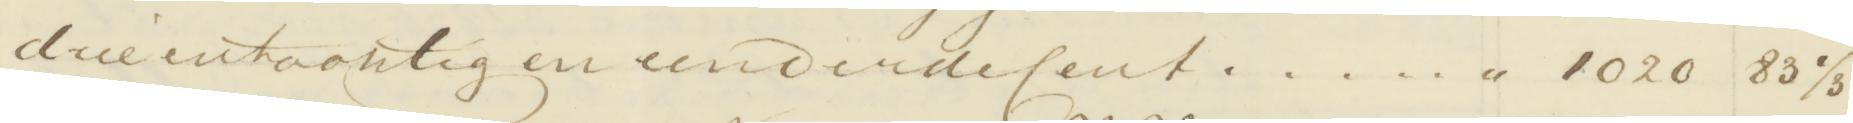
drie en tachtig en eenderde Cent . . . . . „ 1020 83 1/3
